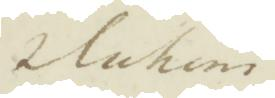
2 lakens
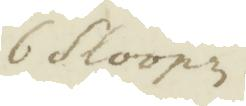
6 sloopen
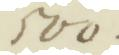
500.
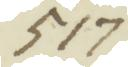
517
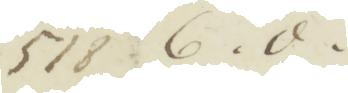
518 6. d
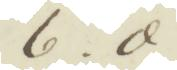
519 6. d
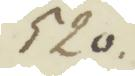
520:
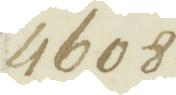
4608
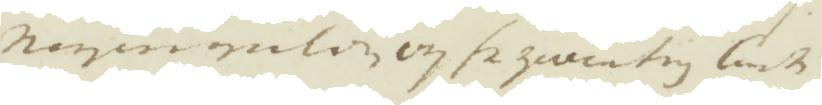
negen gulden vyf & zeventig Cent
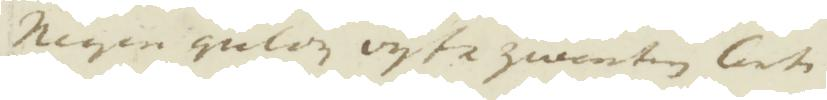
Negen gulden vyf en zeventig Cents
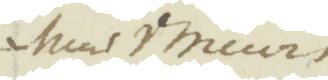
Mevr V Meurs
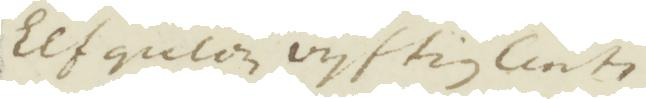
Elf gulden vyftig Cents
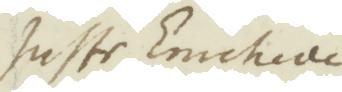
Juffr. Enschedé
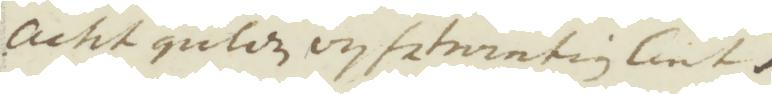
acht gulden vyf en twintig Cents
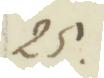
8 25.
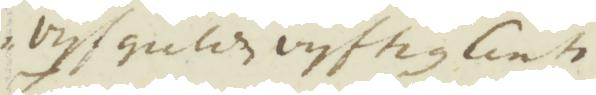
„vyf gulden vyftig Cents
